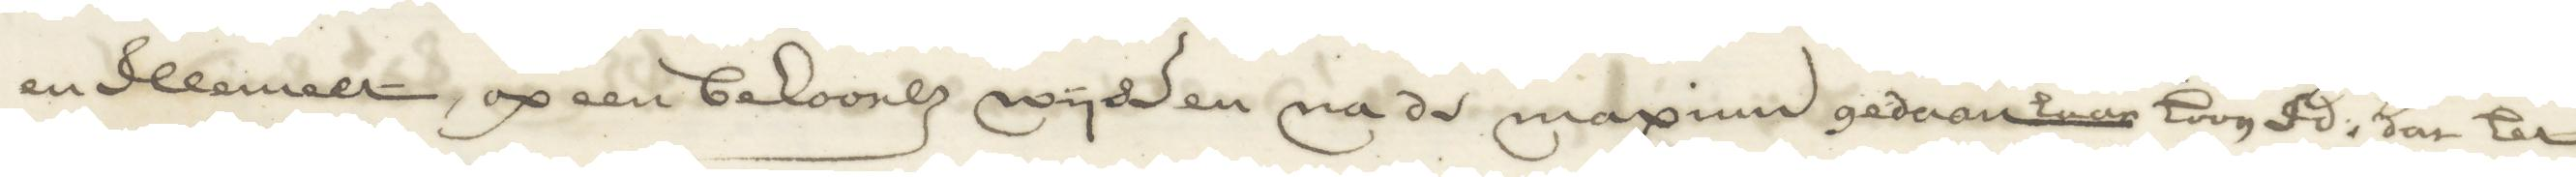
en Ellemeet, op een behoorlijke wijse en na de maxime gedaan haar hoog Ed: dat het
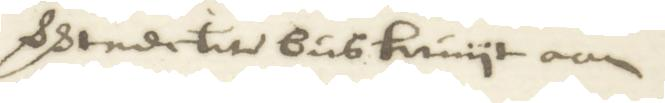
verstreckte buskruijt aan
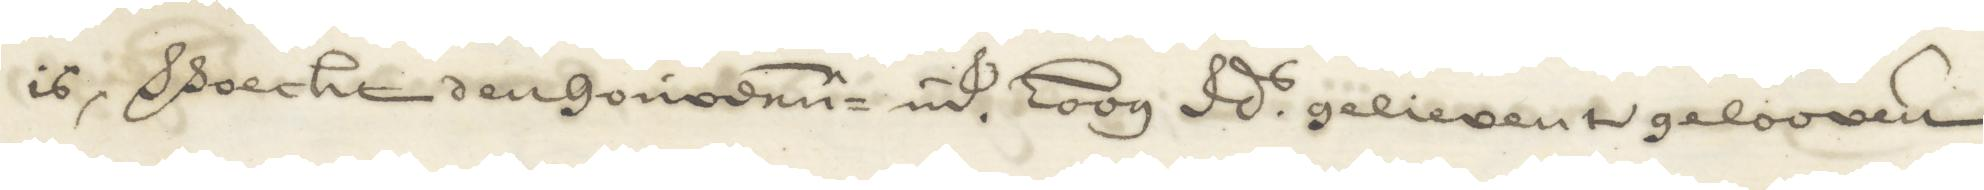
is, versoeckt den gouvern=r uE. hoog Ed.s gelieven te gelooven
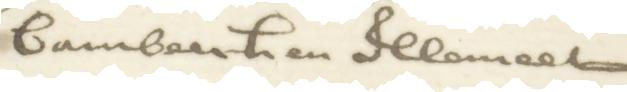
bambeeck en Ellemeet
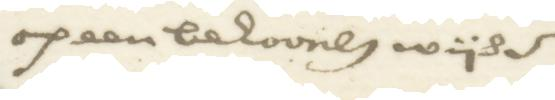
op een behoorlijke wijse
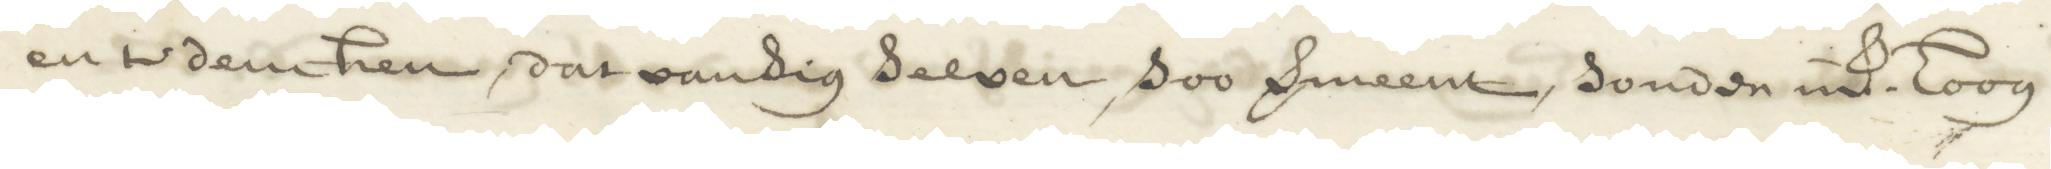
en te dencken, dat van Sig Selven, Soo Vermeent, Sonder uE-hoog
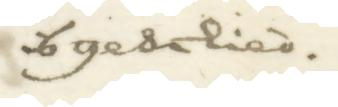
is geschied.
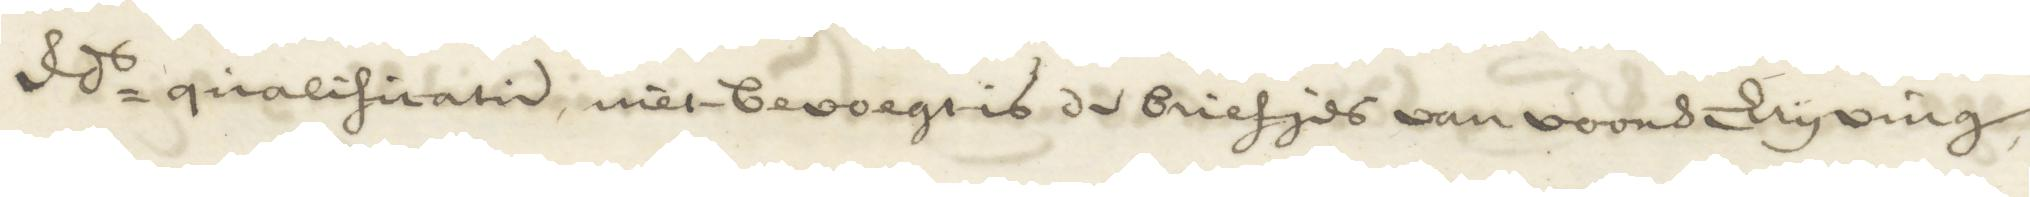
Ed=s qualificatie, niet-bevoegt is de briefjes van voorschrijving,
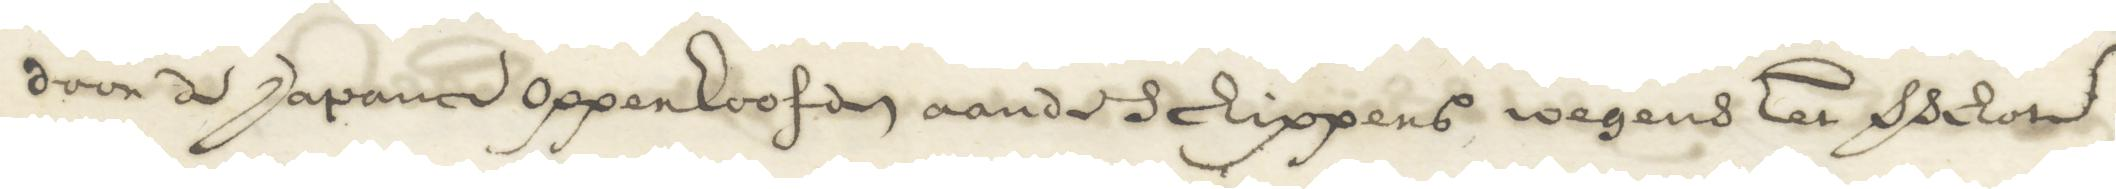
door de japance opperhoofden aan de schippers wegens het verschote
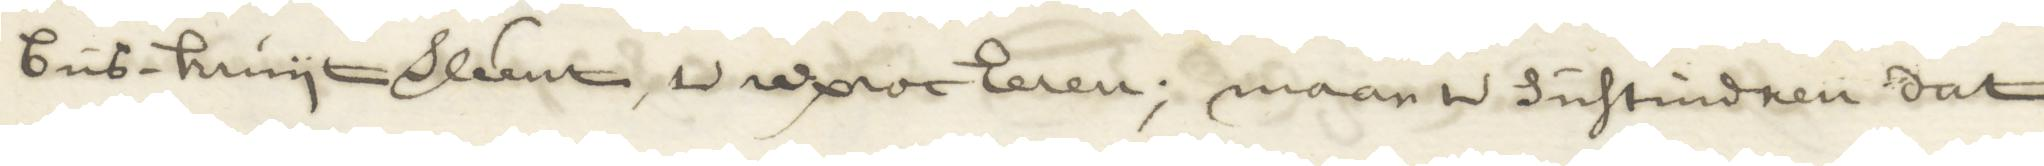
bus-kruijt verleent, te reprocheren; maar te Sustineren dat
